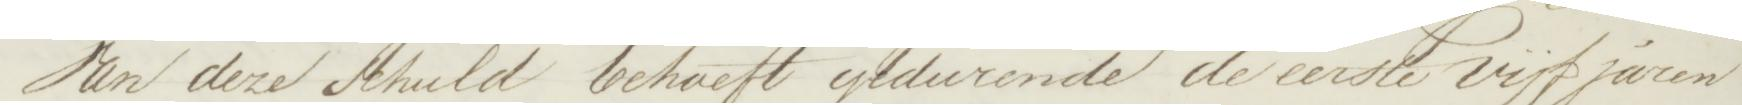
van deze schuld behoeft gedurende de eerste vijf jaren
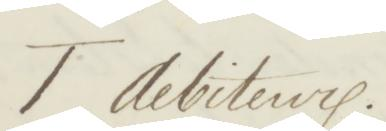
¶ debiteur.
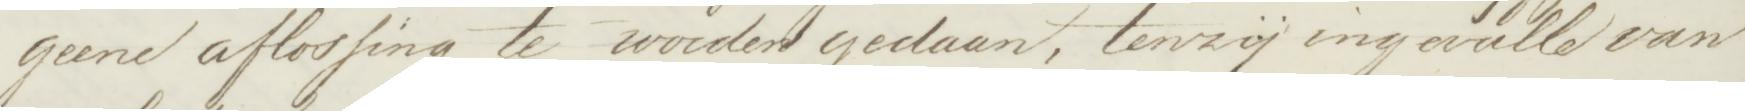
geene aflossing te worden gedaan, tenzij in gevalle van
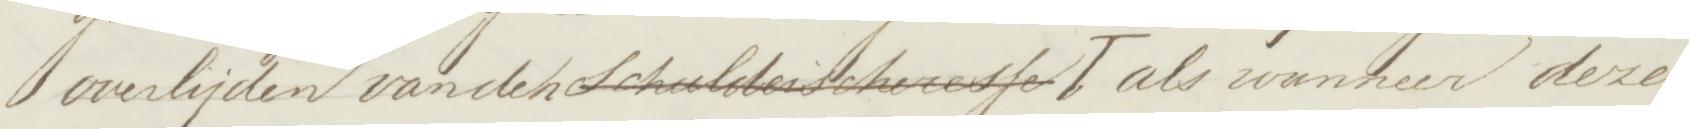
overlijden van den Schuldeischeresse ¶ als wanneer deze
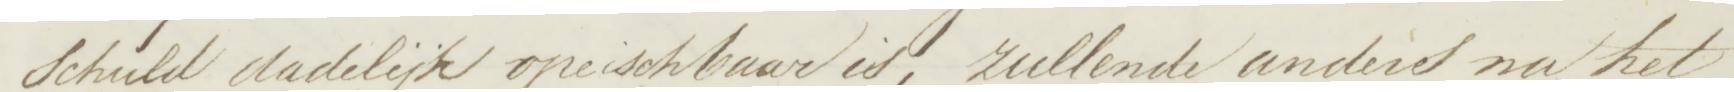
schuld dadelijk opeischbaar is, zullende anders na het
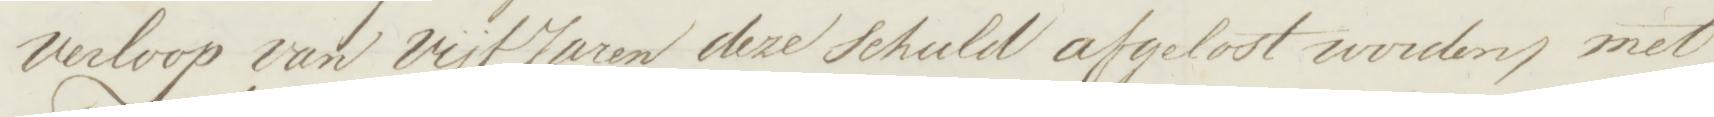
verloop van vijf Jaren deze schuld afgelost worden, met
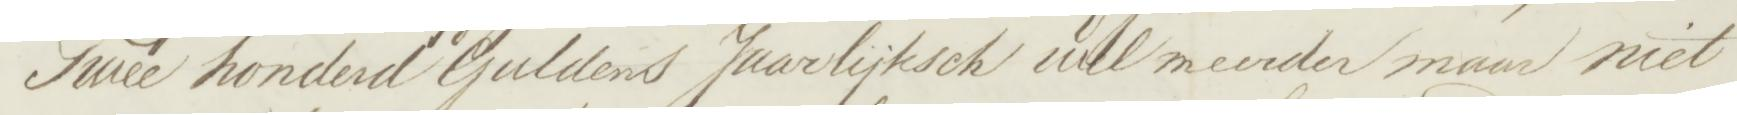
Twee honderd Guldens Jaarlijksch wel meerder maar niet
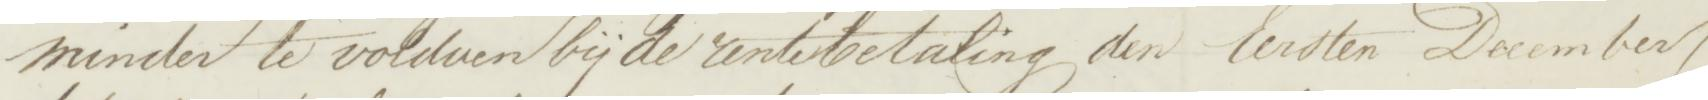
minder te voldoen bij de rente betaling den Eersten December
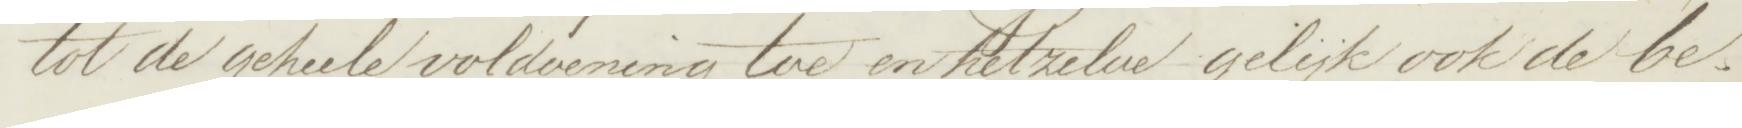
tot de geheele voldoening toe en hetzelve gelijk ook de be„
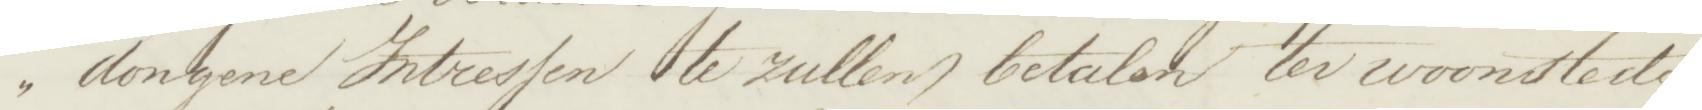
„dongene Intressen te zullen betalen ter woonstede
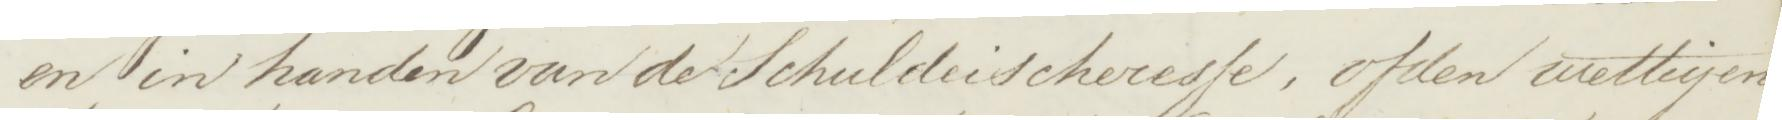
en in handen van de Schuldeischeresse, of den wettigen
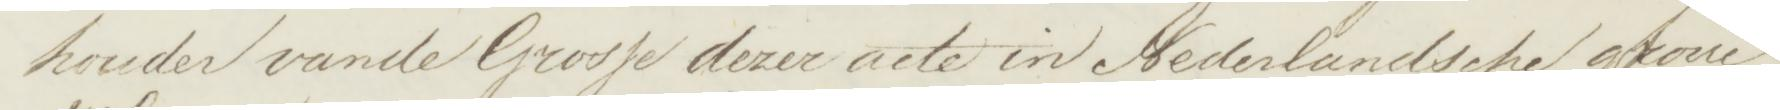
houder vande Grosse dezer acte in Nederlandsche grove
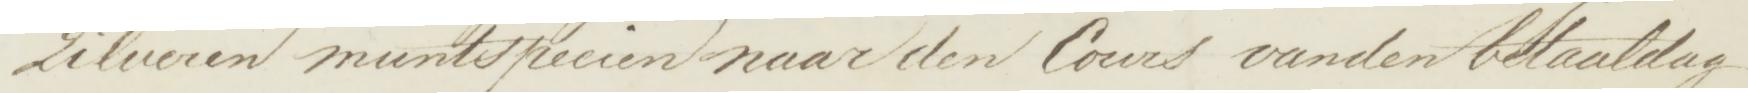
zilveren muntspecien naar den Cours van den betaaldag
